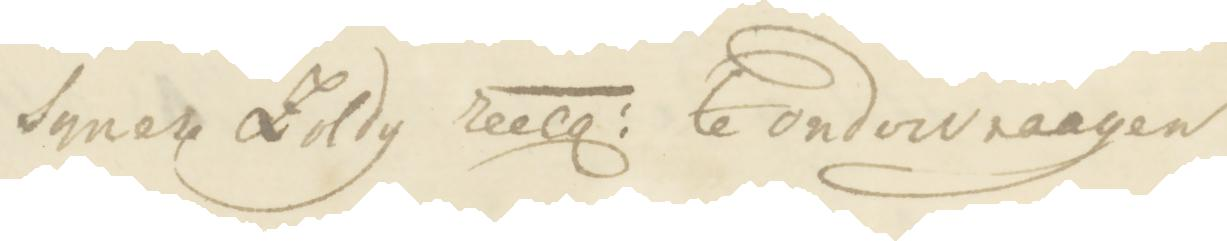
syner Zoldy reecq: te ondervraagen
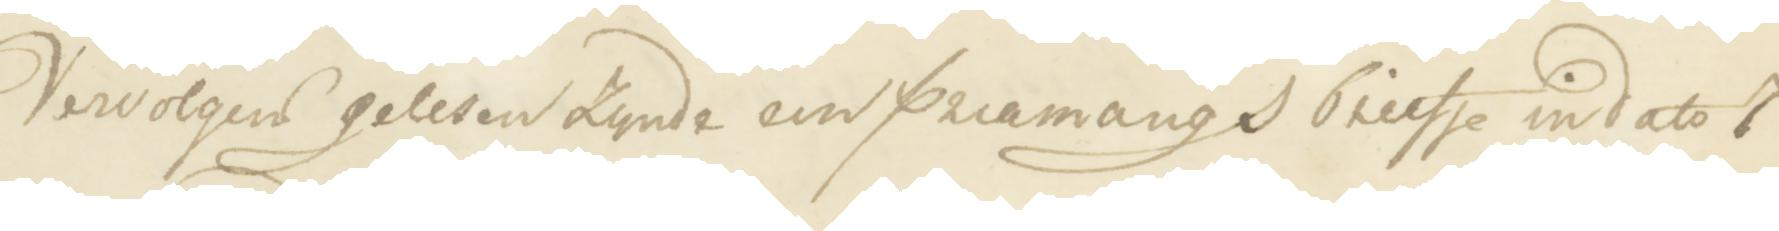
Vervolgens gelesen zynde een priamangs briefje in dato 7
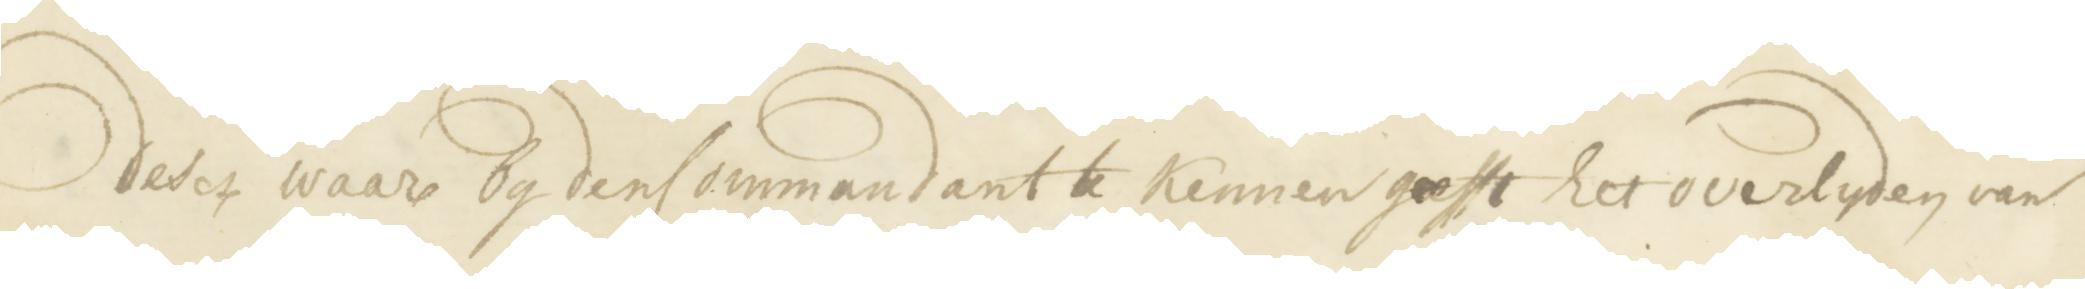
deser waar by den Commandant te kennen geeft het overlyden van
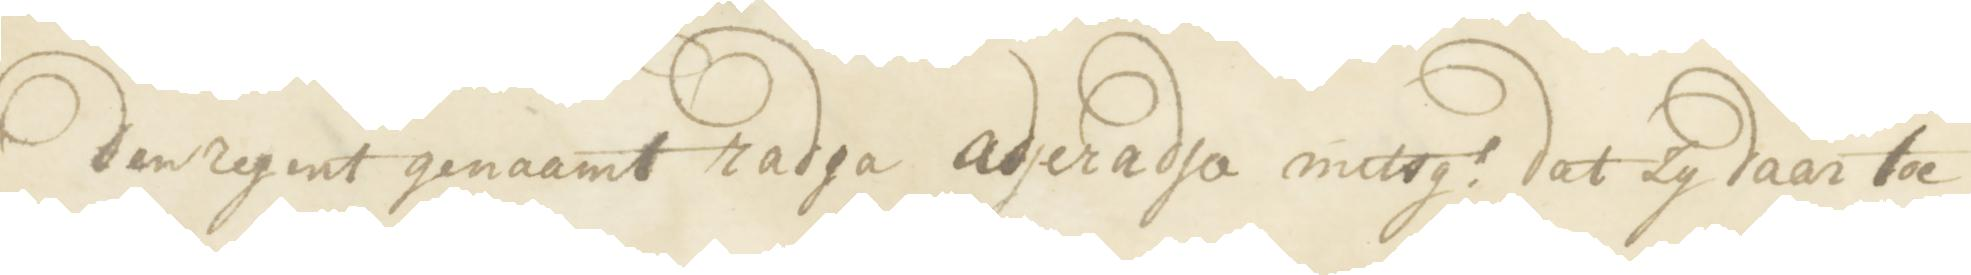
den regent genaamt radja adjeradja mitsg.s dat zy daar toe
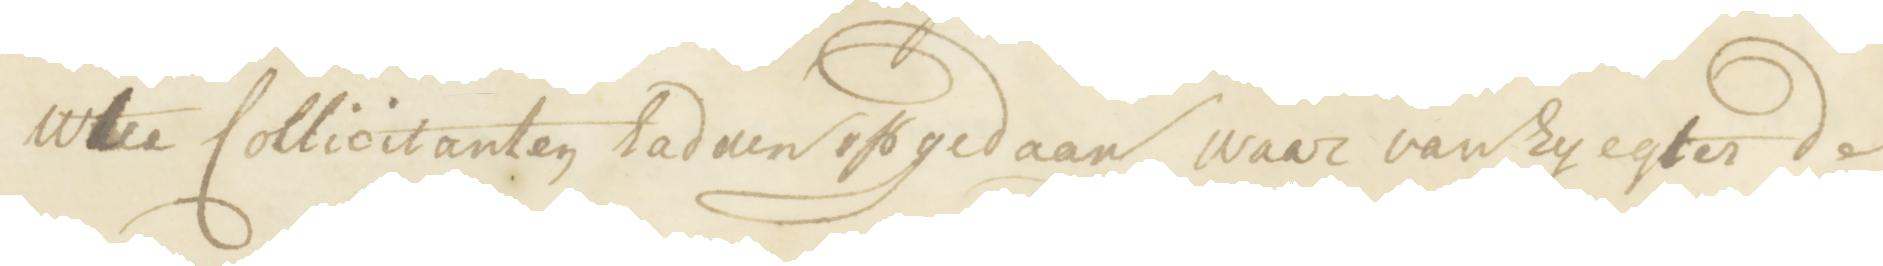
We Collicitanten hadden opgedaan waar van hy egter de
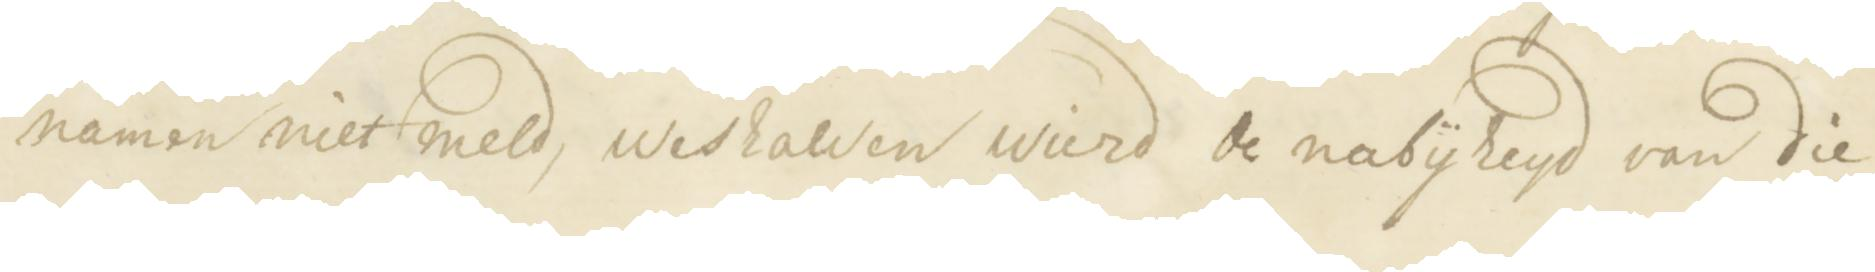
namen niet meld, weshalven wierd de nabijheyd van die
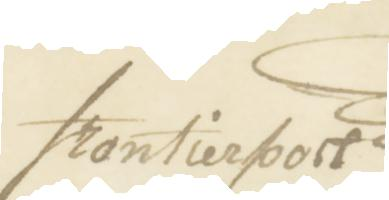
frontierpost
